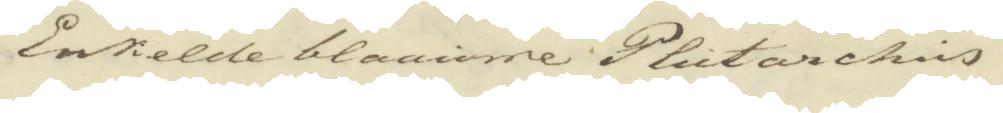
Enkelde blaauwe Plutarchus
